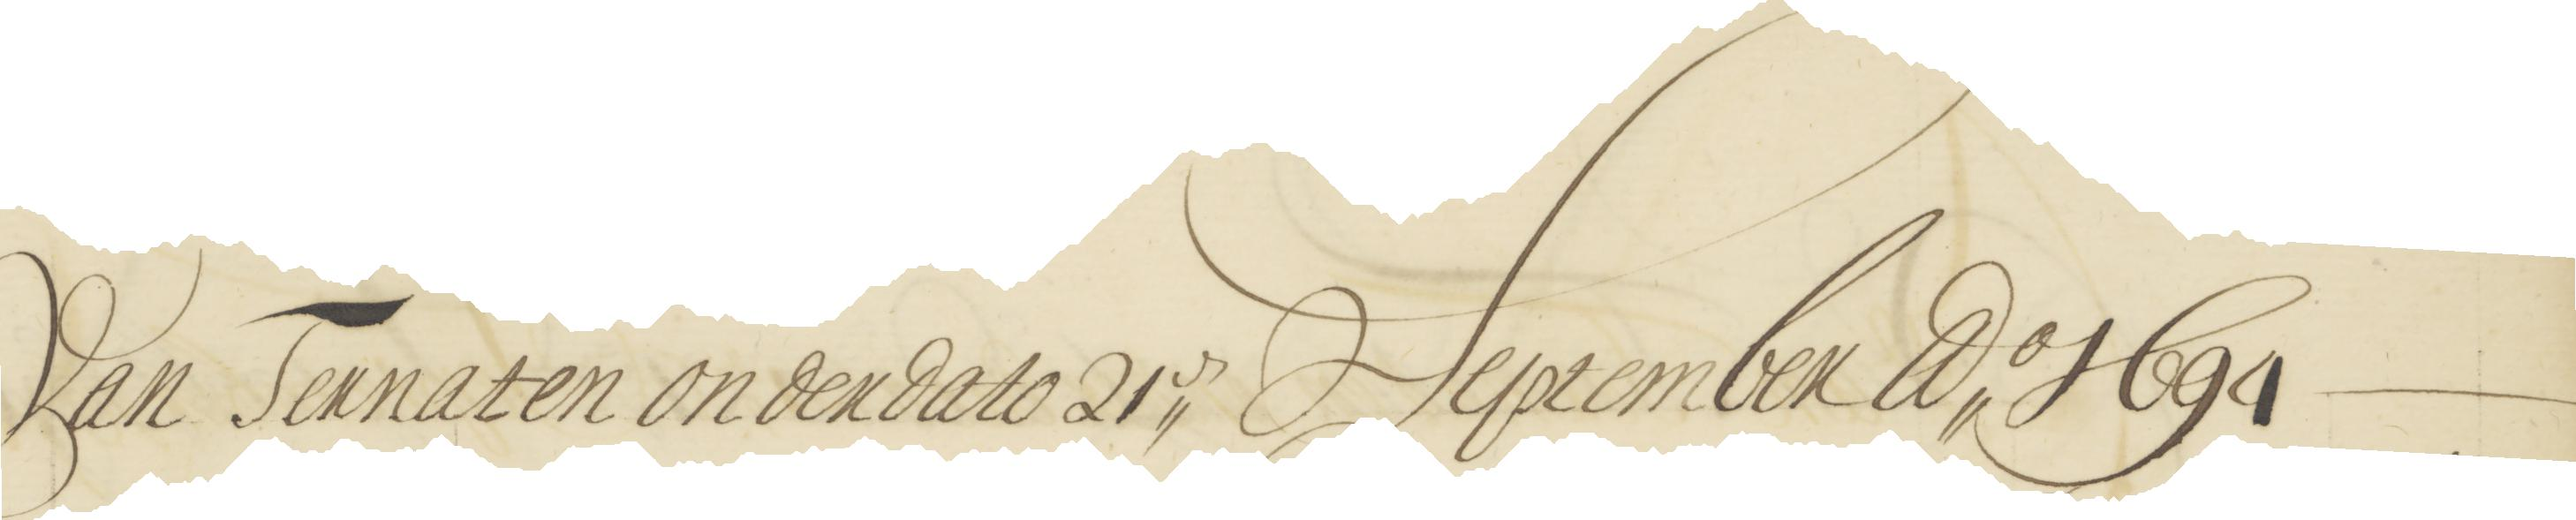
Van Ternaten onder dato 21„en September A„o 1694 —
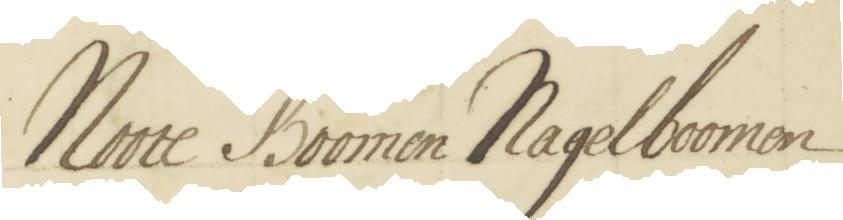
Noote Boomen Nagelboomen
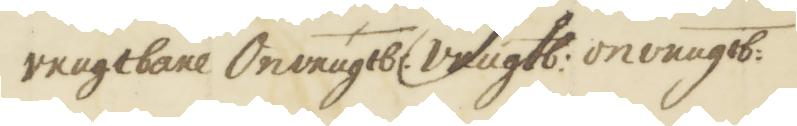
vrugtbare Onvrugtb: vrugtb: onvrugtb:
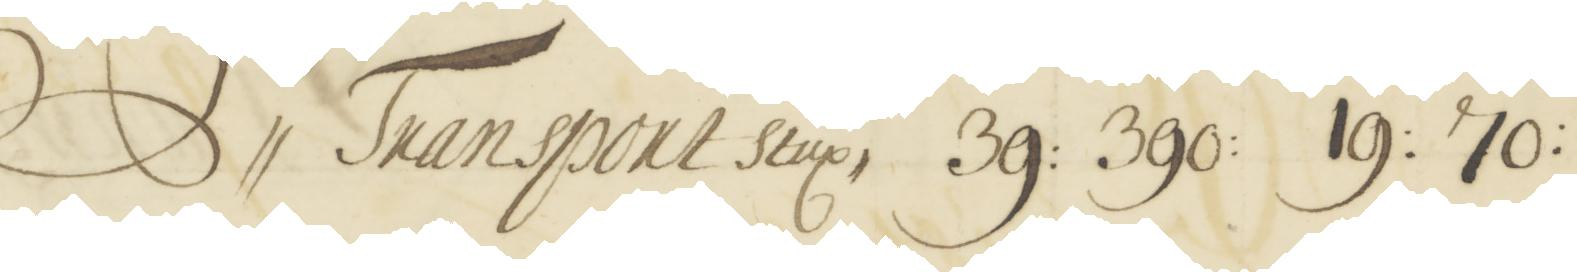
P„r Transport stux„ 39: 390: 19: 70:
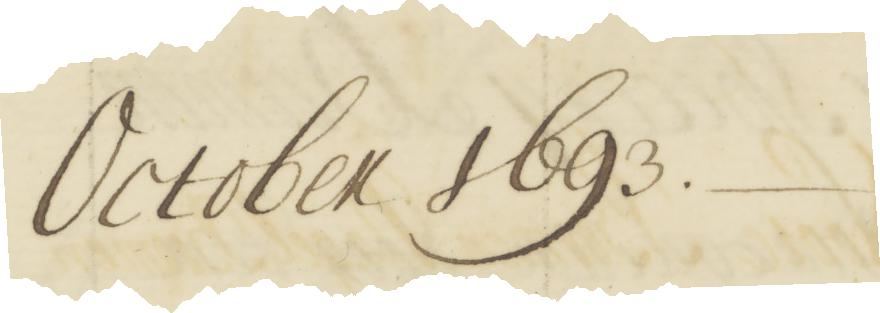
October 1693. —
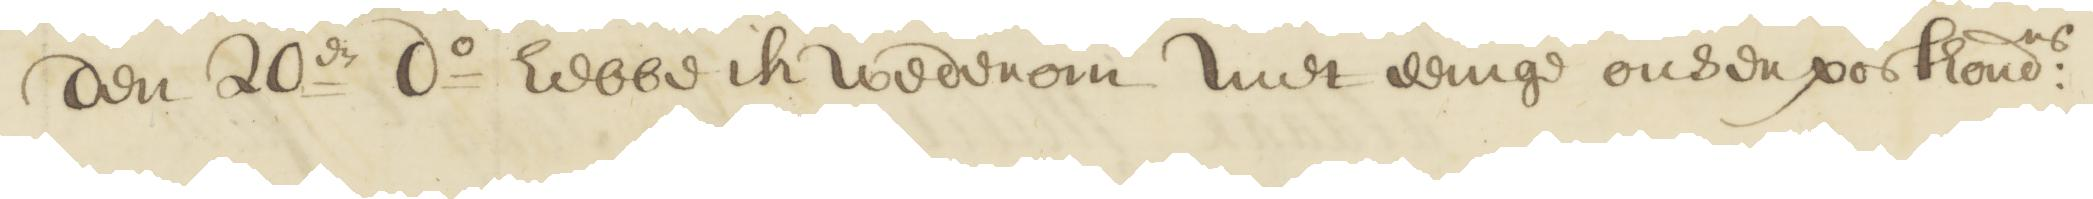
den 20=en d=o hebbe ik wederom met eenige onser posthoud:rs
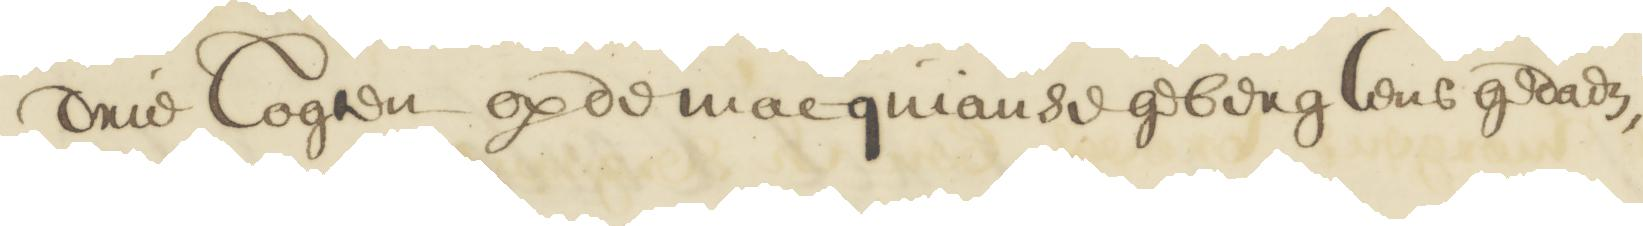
drie Togten op de macquianse gebergtens gedaen,
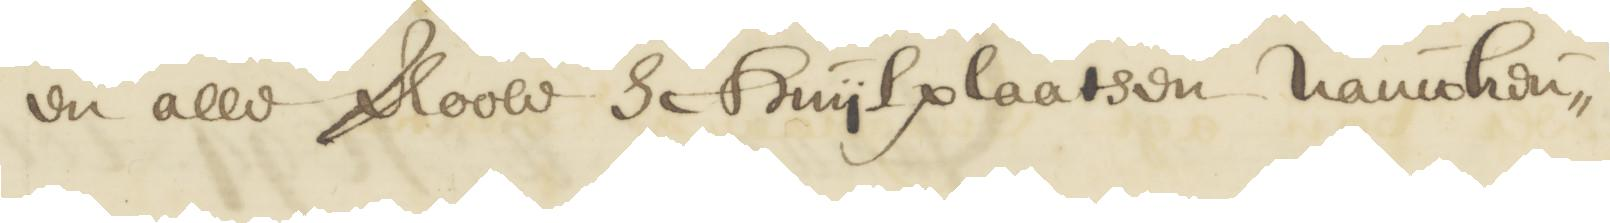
en alle verhoole schuijtplaatsen nauwkeu„
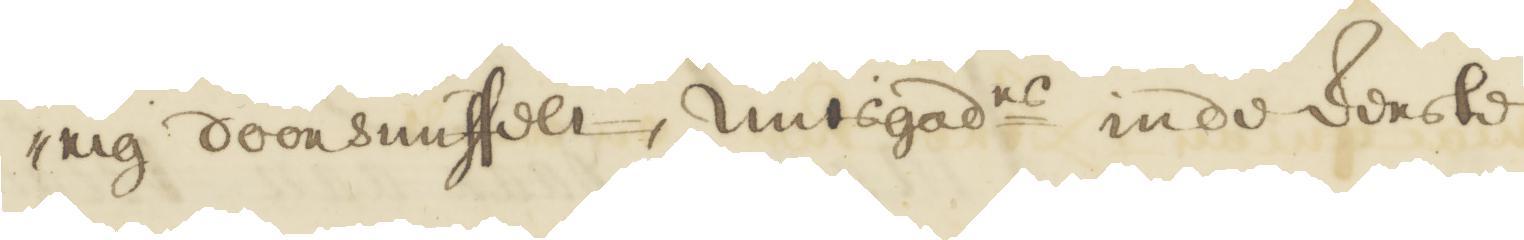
„rig doorsnuffelt, mitsgad=rs in de Eerste
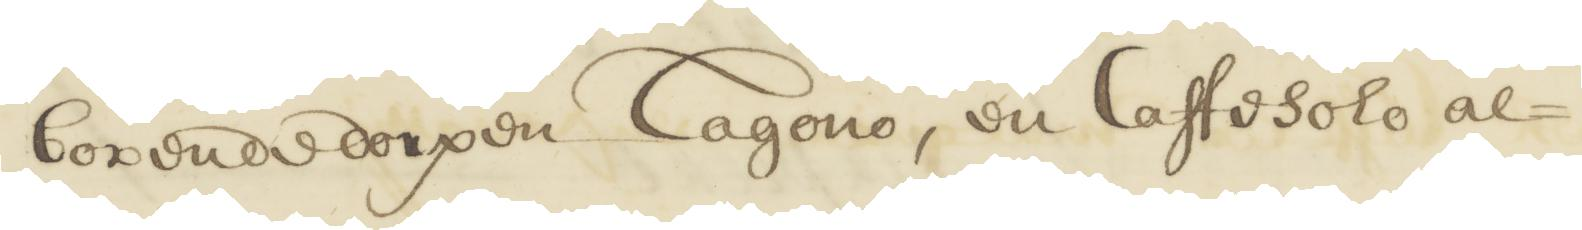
boven de dorpen Tagono, en taffesoho al=
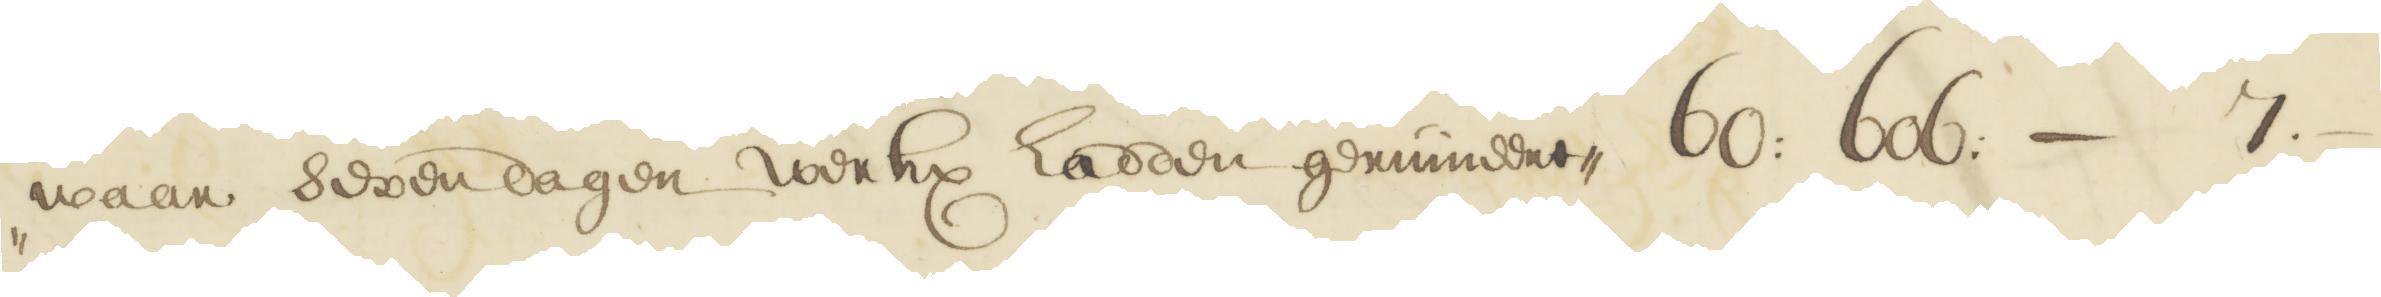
„waar seven dagen werkx hadden geruineert„ 60: 606: — 7.—
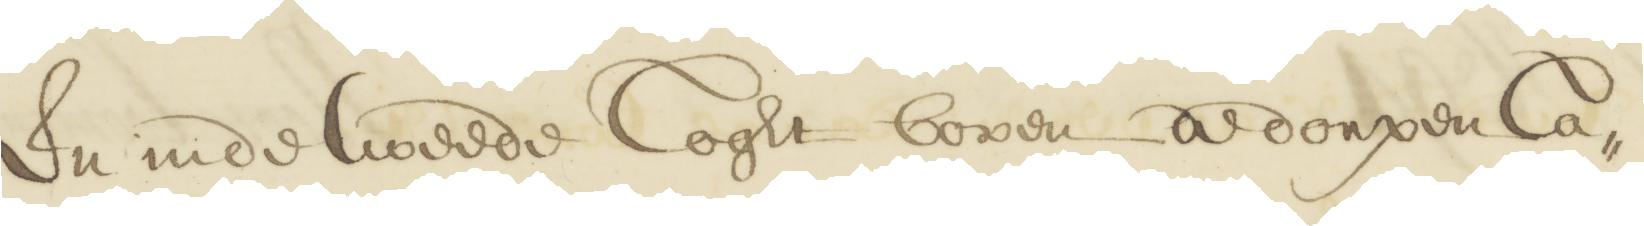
En inde tweede Toght boven dedorpen Ta„
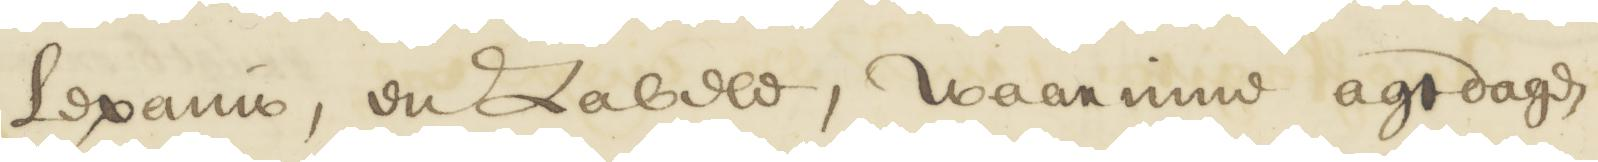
lepauw, en zabele, waarinne agt dagen
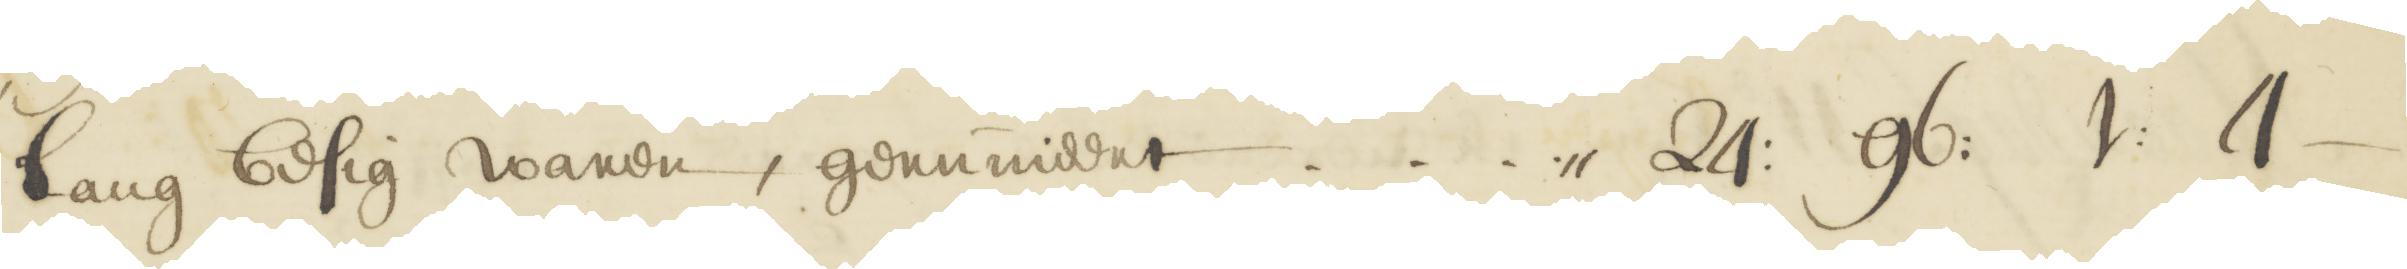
lang besig waren, gerunieert . . . .„ 24: 96: 1: 4 —
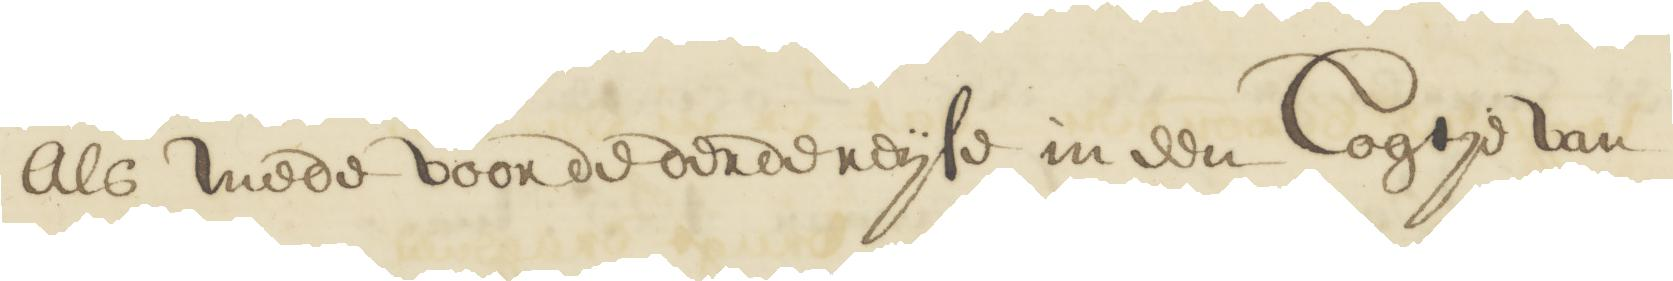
als mede voor de derde reijse in een Togtje van
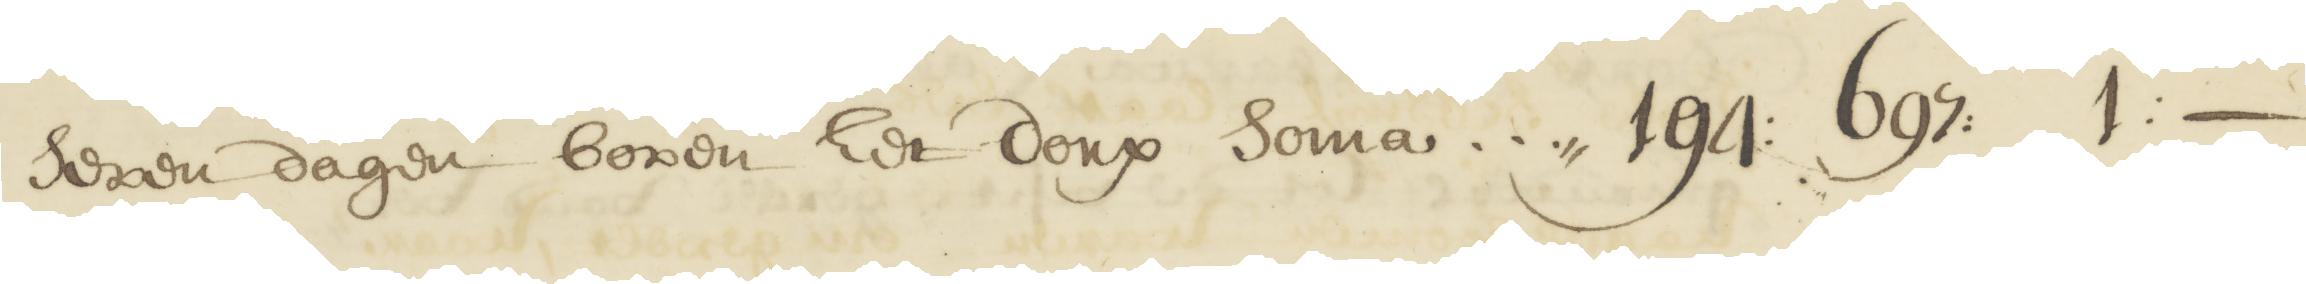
seven dagen boven het dorp soma . . .„ 194: 697: 1: —
